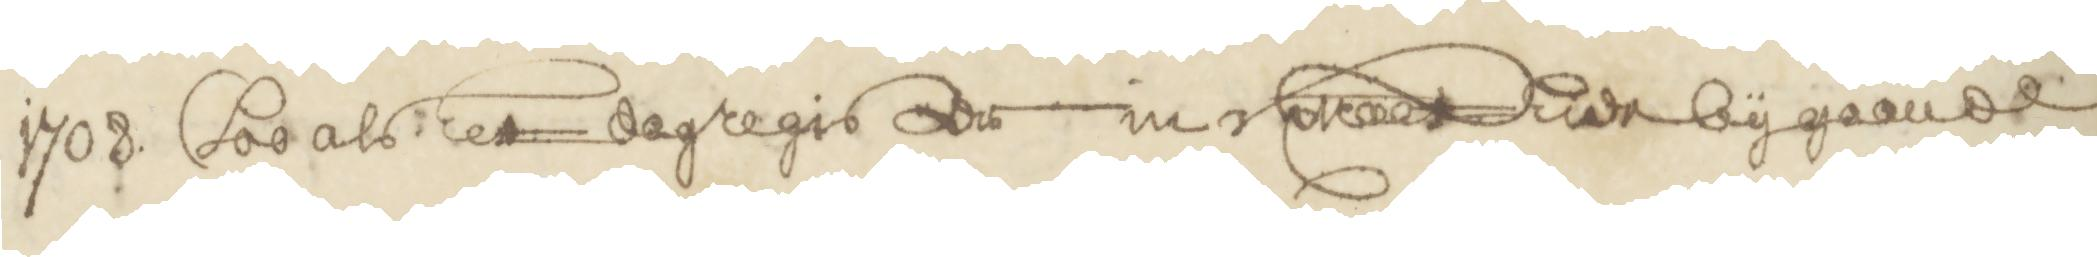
1708. (soo als het dagregister in extract hier bij gaande
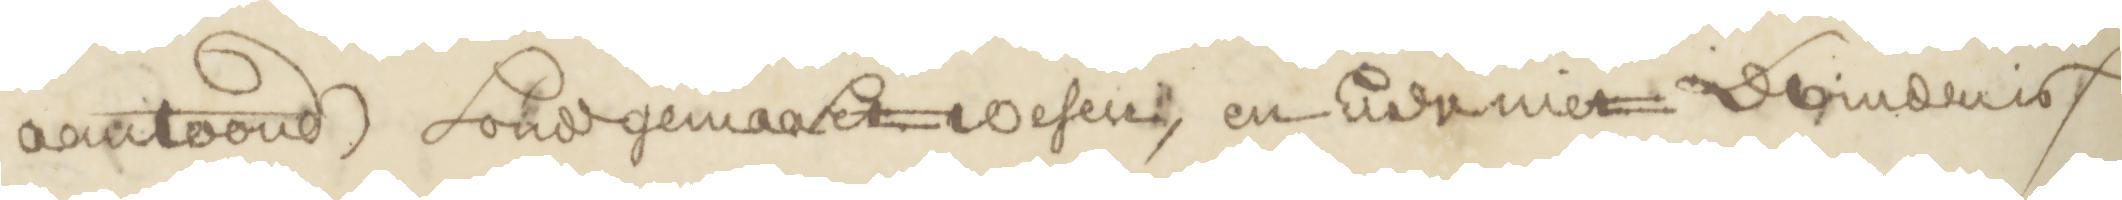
aantoond) soude gemaakt wesen, en hier niet te vinden is
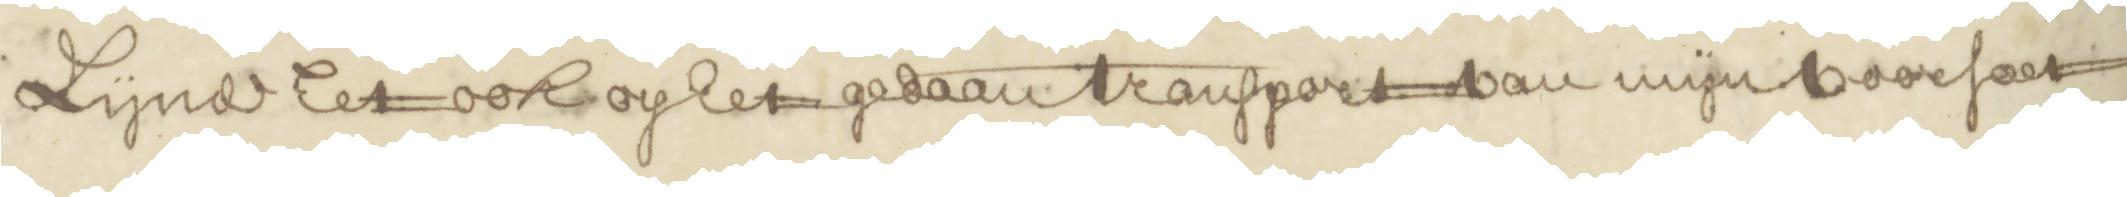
Zijnde het ook op het gedaan transport van mijn voorsaet
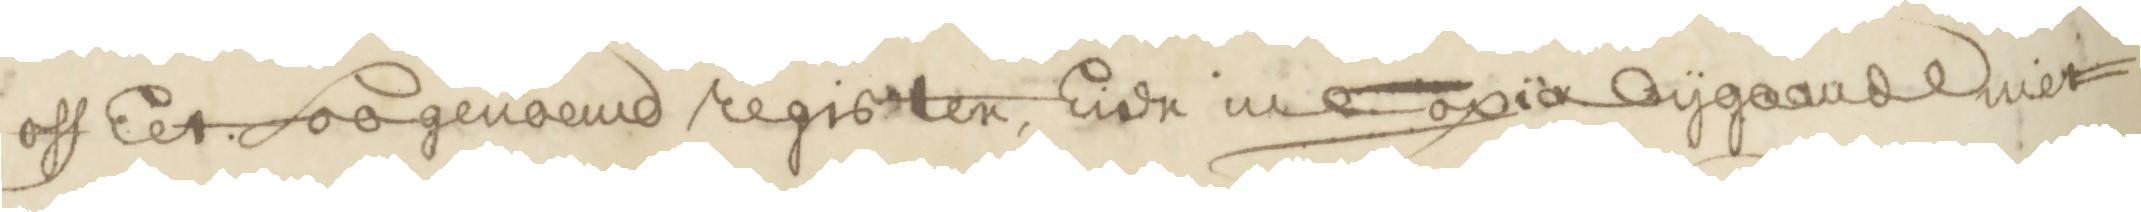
off het. soo genoemd register, hier in Copia bijgaande niet
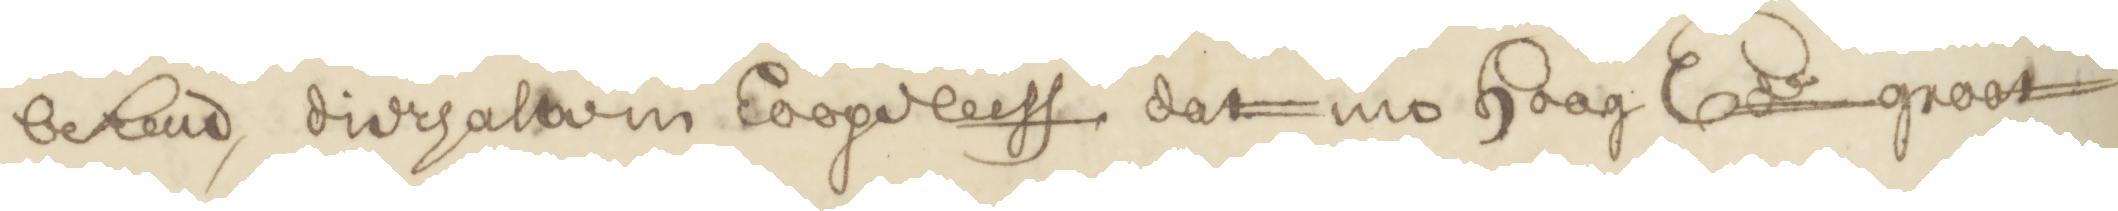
bekend, dierhalve in hoope leeff, dat uw Hoog Ed=e groot
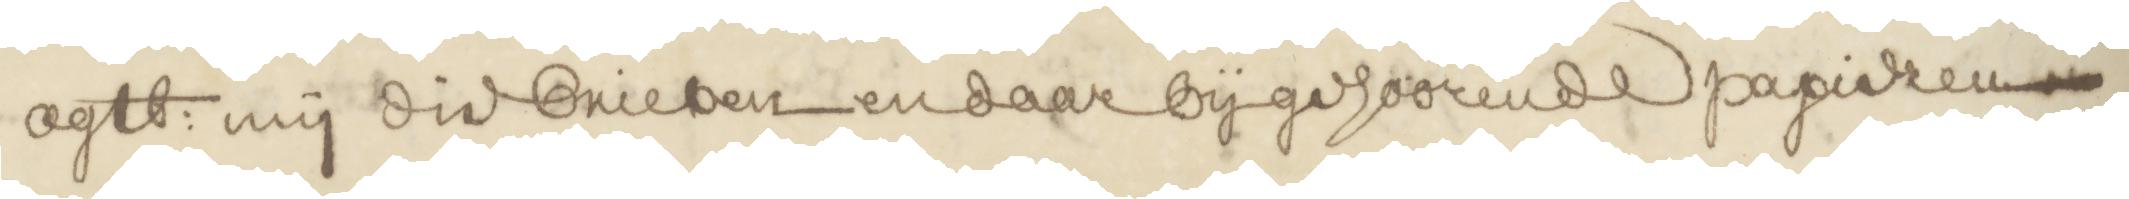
agtb: mij die brieven en daar bij gehoorende papieren
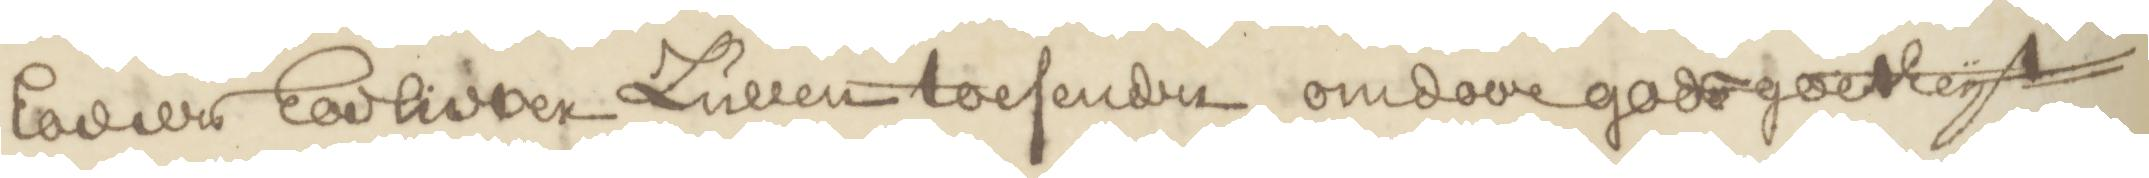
hoeers hoe liever Zullen toesenden, om door godsgoetheijt
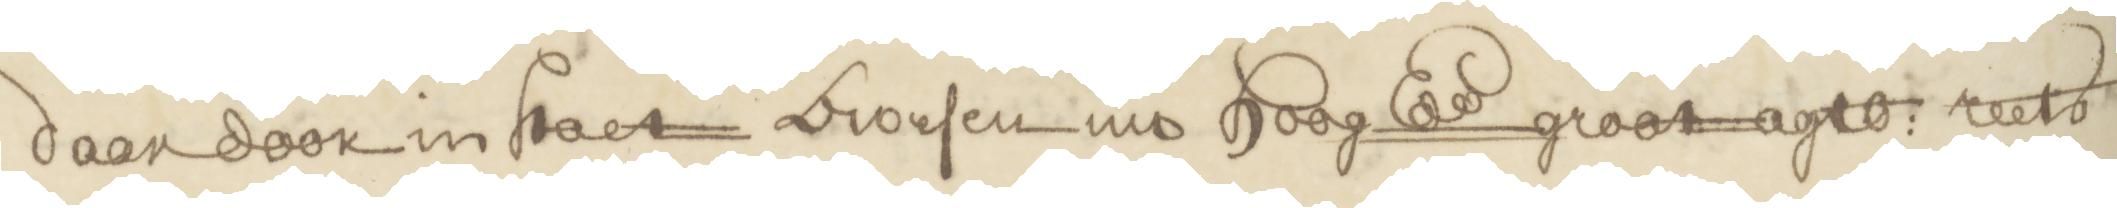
daar door in staet tewesen uw Hoog Ed=e groot agtb: reets
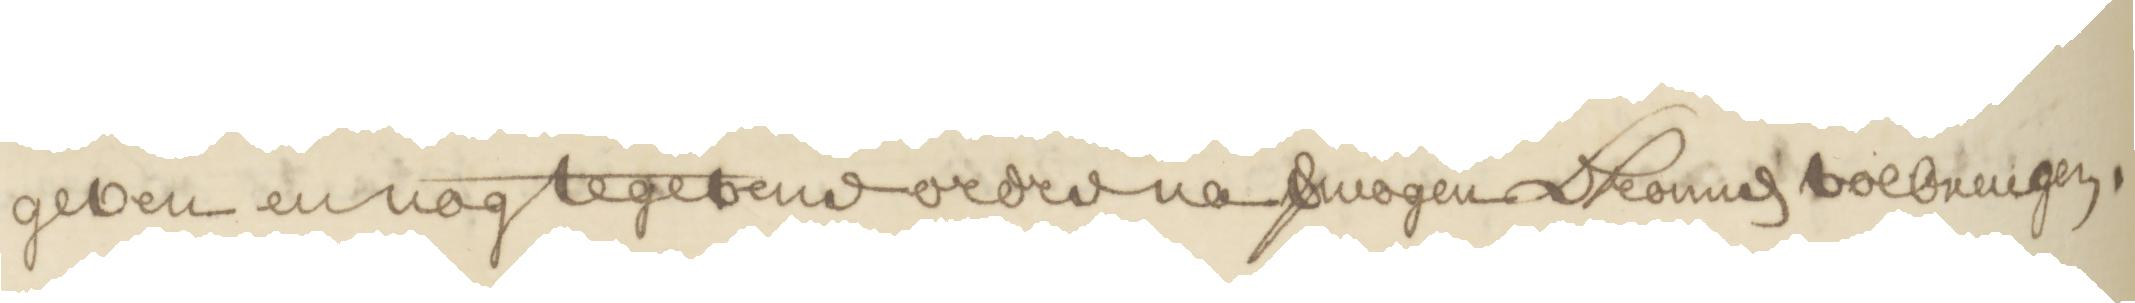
geven en nog tegevene ordre na vermogen tekonnen volbrengen.
